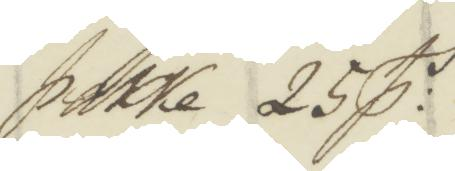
pakke 25 p:s =
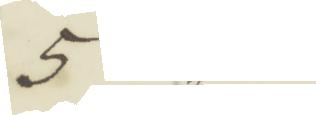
5 „
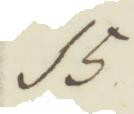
15 „ =
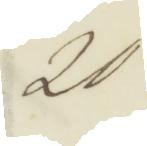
20 „
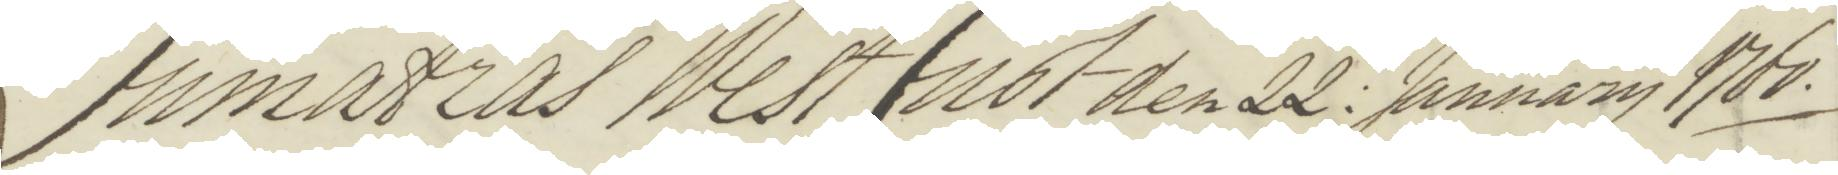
Sumatras West Cust den 22:' Januarij 1760.
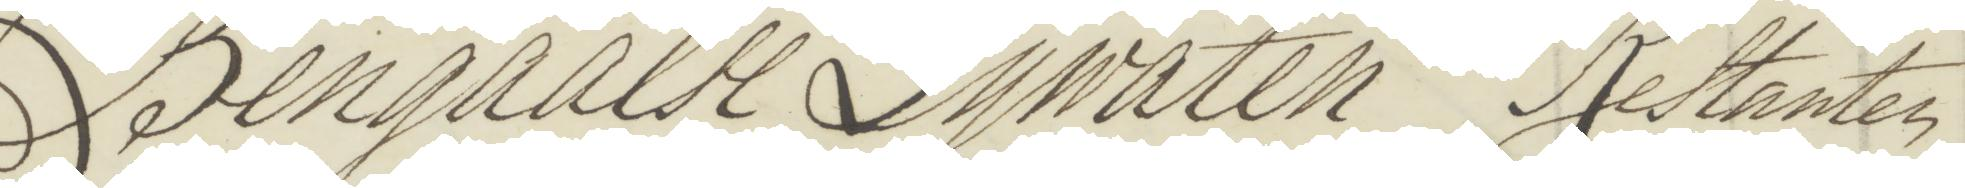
Bengaaese Lijwaten Restanten
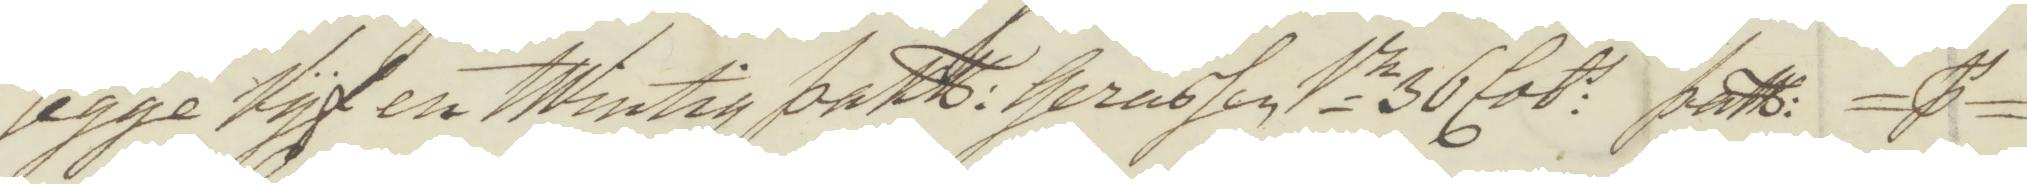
Segge vijf en twintig pakk: Gerassen V=n 36 Cob:s patb: =p:s=
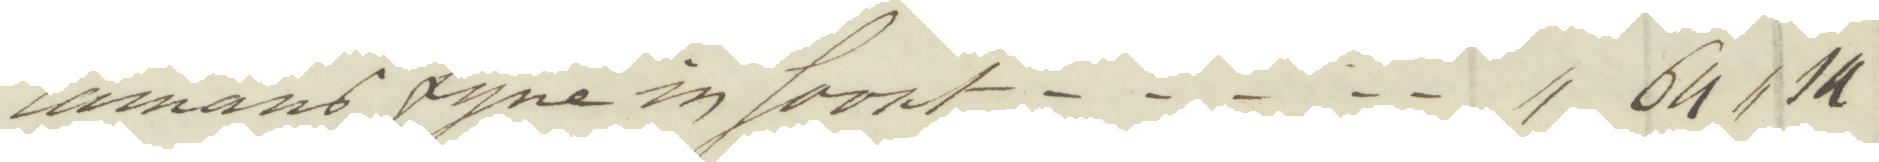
hamans fijne in soort - - - - - „ 64 „14
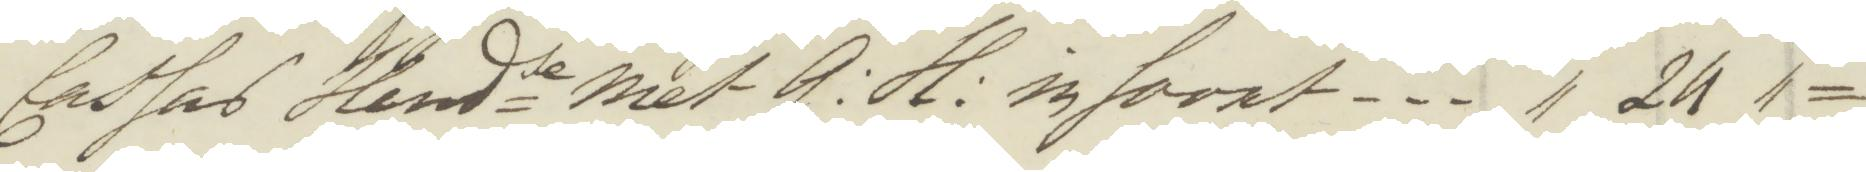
Cassas Hend=se met G: H: in soort - - - „ 24 „=
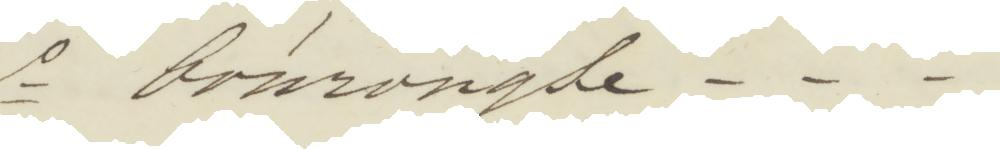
—:o 5 bourongse - - - - - - „7 „—
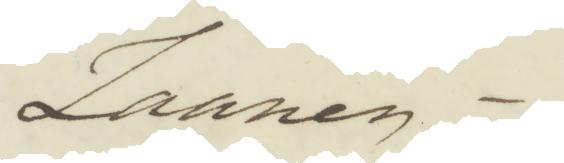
Zaanen - - - - - - - - „ 6 „16
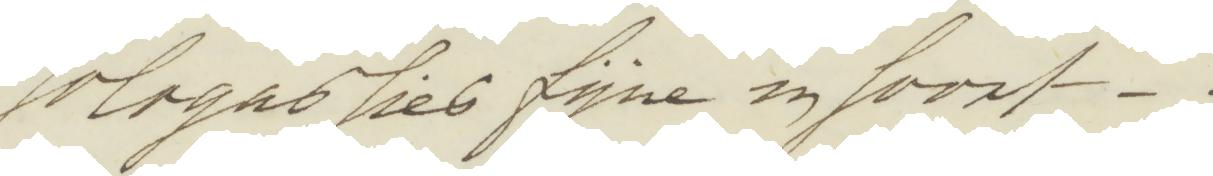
Sologassies fijne in soort - - - - - „ 5 „ 40
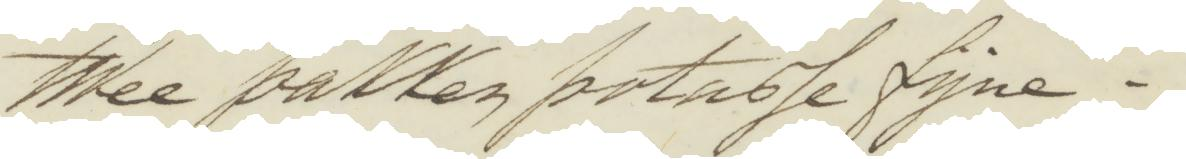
twee pakken potasse fijne - - - - - - „ 1 „ -
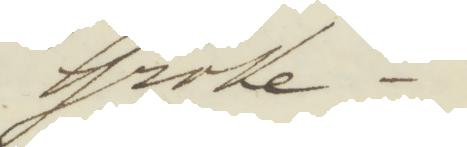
„ „ „ „ grote - - - - - - „ 2 „ -
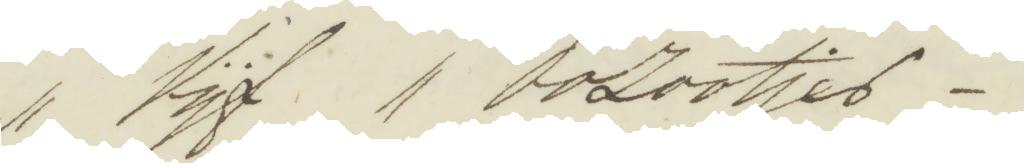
„ vijf „ do Zootjes - - - - - - - - „ = „ =
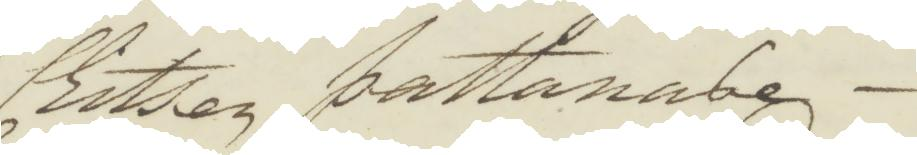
Chitsen pattanabe - - - - - - - „ 3 „ 95
